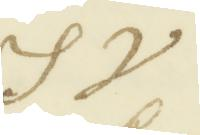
S V
